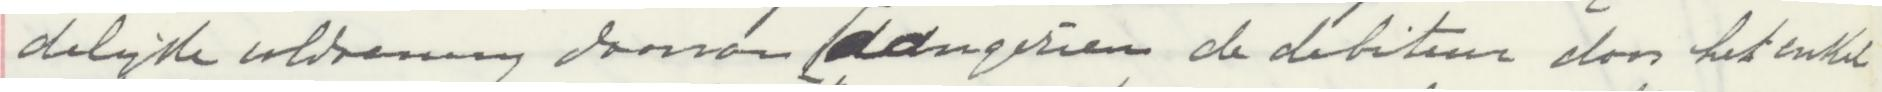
delijke voldoening daarvan [aangezien de debiteur door het enkel
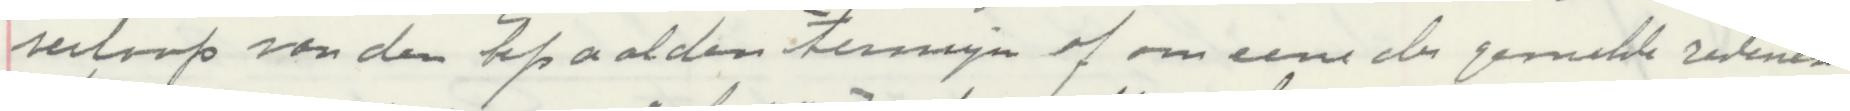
verloop van den bepaalden termijn of om eens de gemelde redenen
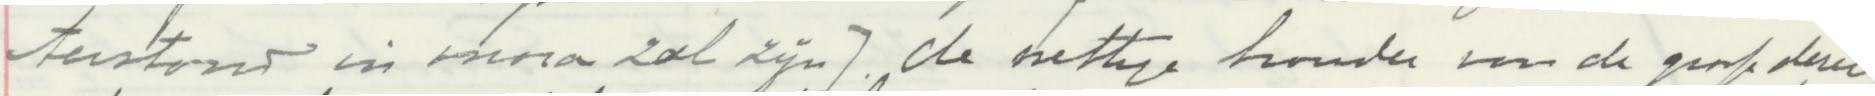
terstond in mora zal zijn] de wettige houder van de grosse door
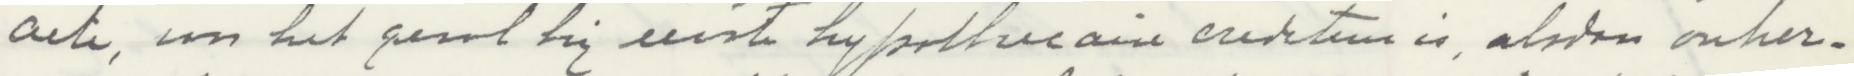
acte, voor het geval bij eerste hypothecaire crediteur is, alsdan onher-
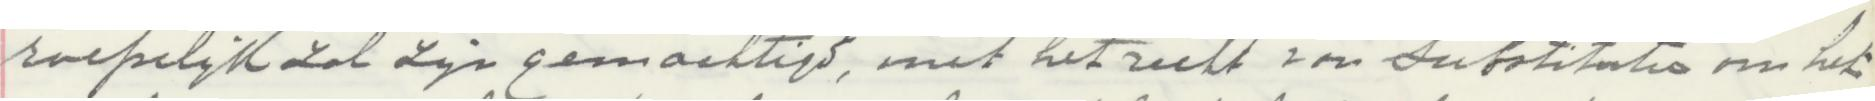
roepelijk zal zijn gemachtigd, met het recht van substitutie om het
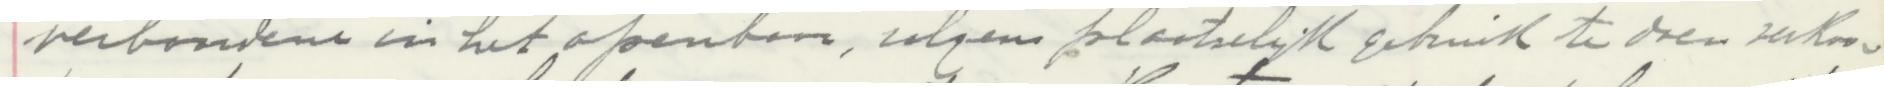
verbondene in het openbaar, volgens plaatselijk gebruik te doen verkoo-
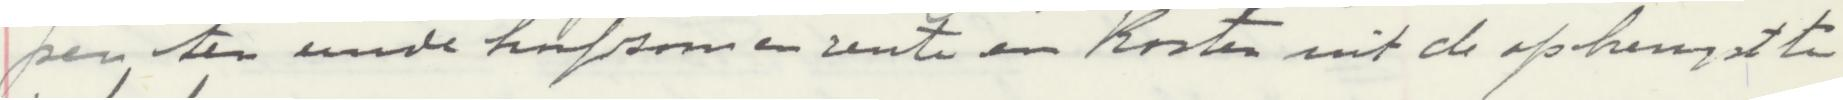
pen ten einde hoofdsom en rente en kosten uit de opbrengst te
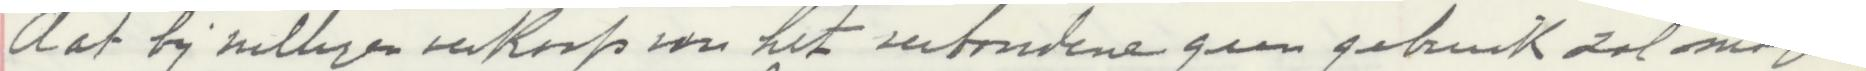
dat bij willigen verkoop van het verbondene geen gebruik zal mogen
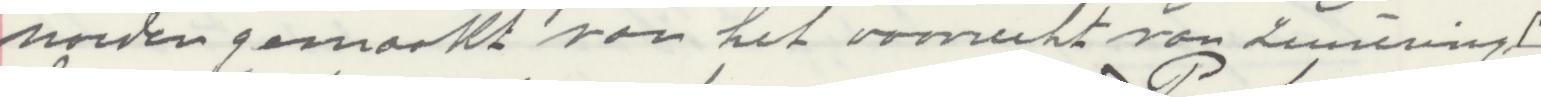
worden gemaakt van het voorrecht van zuivering ¶
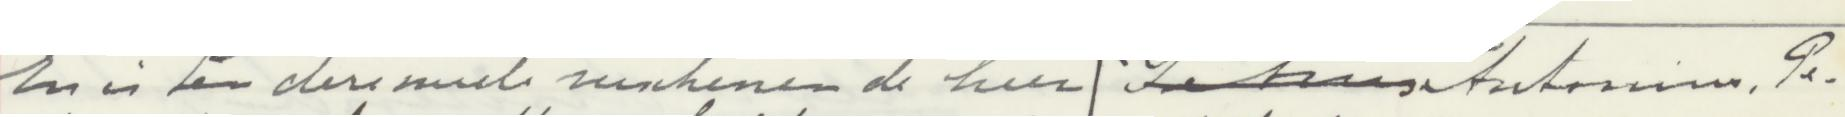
En is ten deze mede verschenen de heer ¶ Petrus Antonius, Pe-
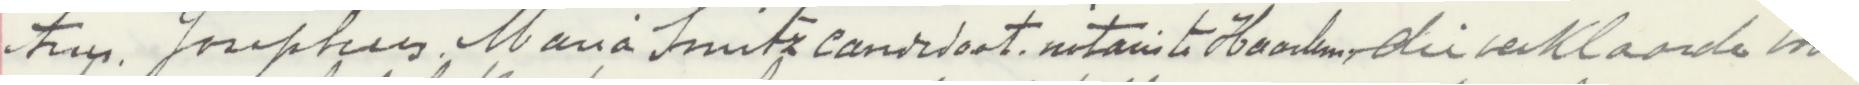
trus. Josephes Maria Smitz candidaat - notaris te Haarlem die verklaarde voor
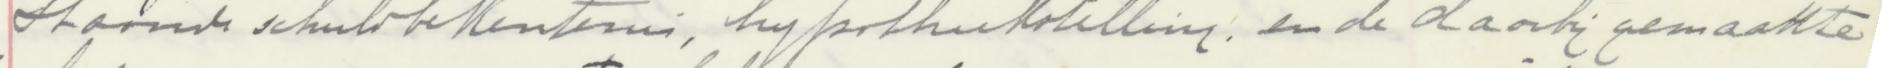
staande schuldbekentenis, hypotheekstelling, en de daarbij gemaakte
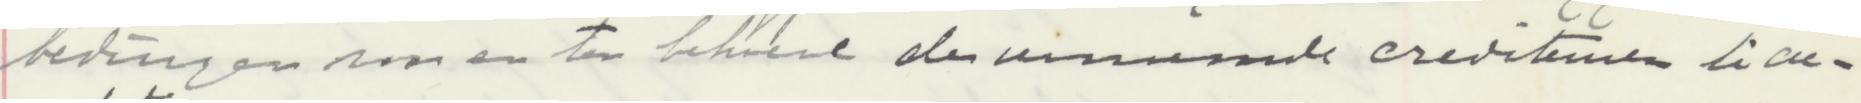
bedingen voor en ter behoeve des innemende crediteuren te ac-
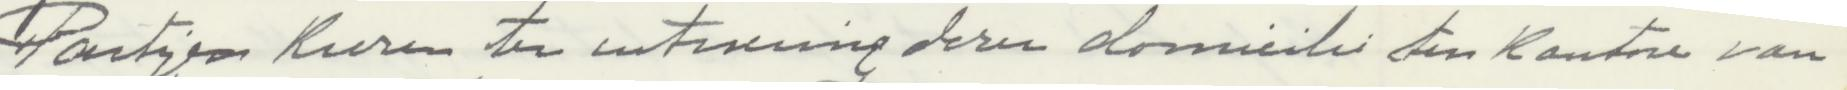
Partijen kiezen ten uitvoering dezer domicilie ten kantore van
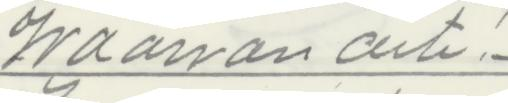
Waarvan acte !
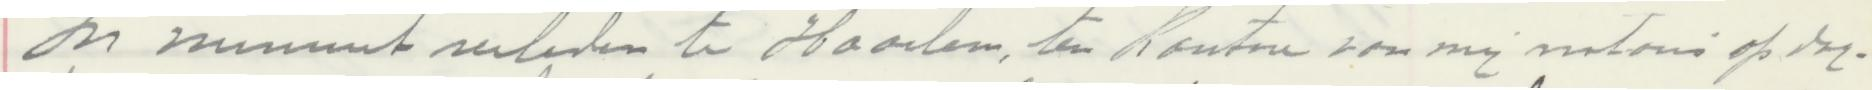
In minuut verleden te Haarlem, ten Kantore van mij notaris op en-
